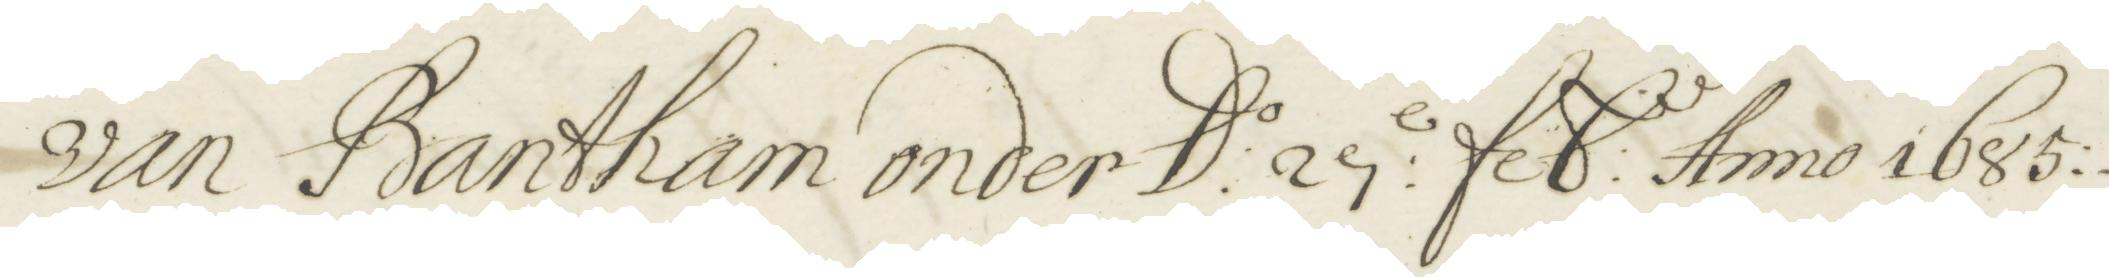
van Bantham onder D:o 27:e feb: Anno 1685:
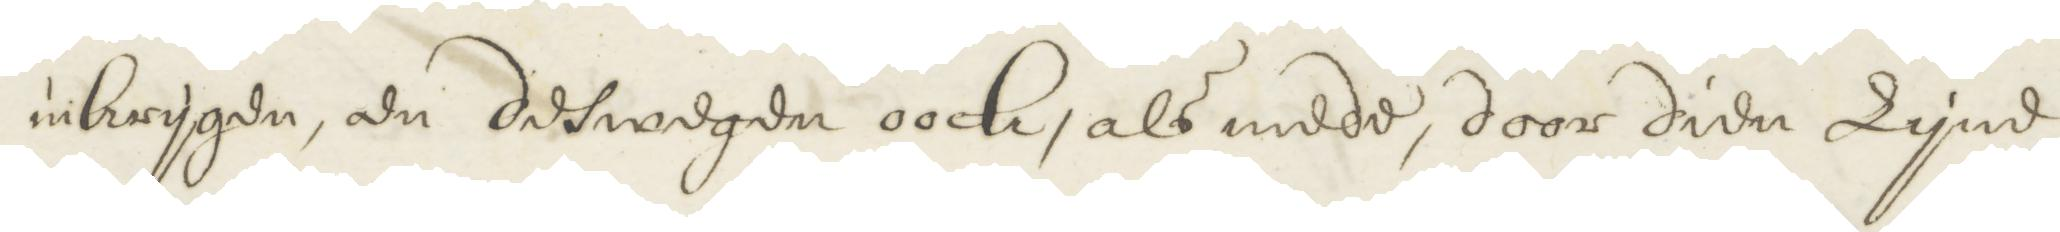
uikrijgen, en deswegen oock, als mede, door dien zijne
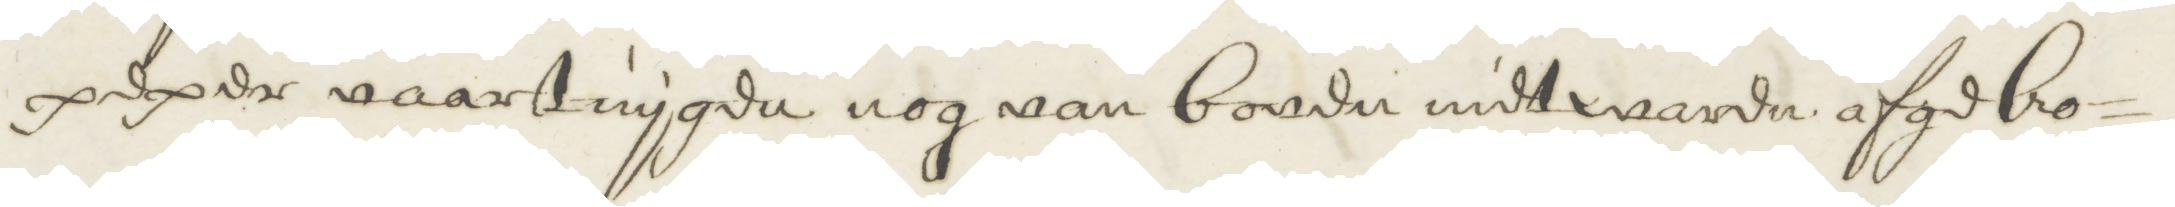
peper vaartuijgen nog van boven niet waren afgeko=
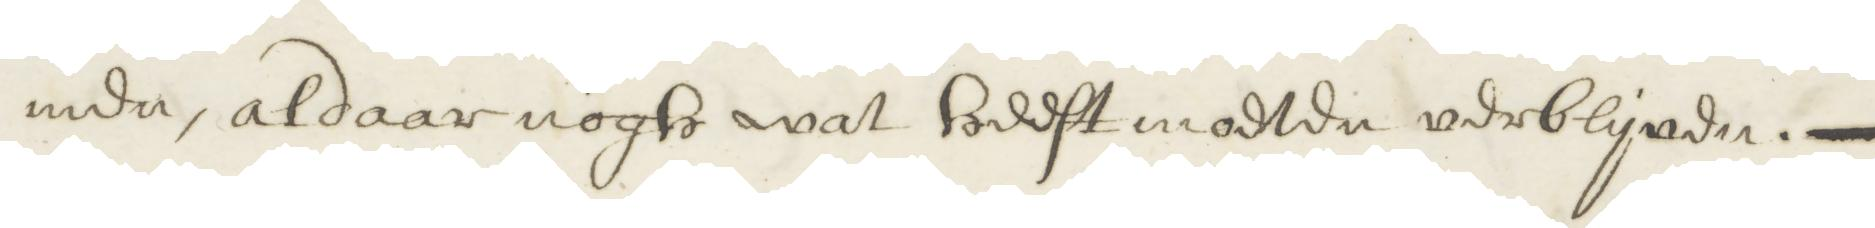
men, aldaar nogh wat heeft moeten verblijven.
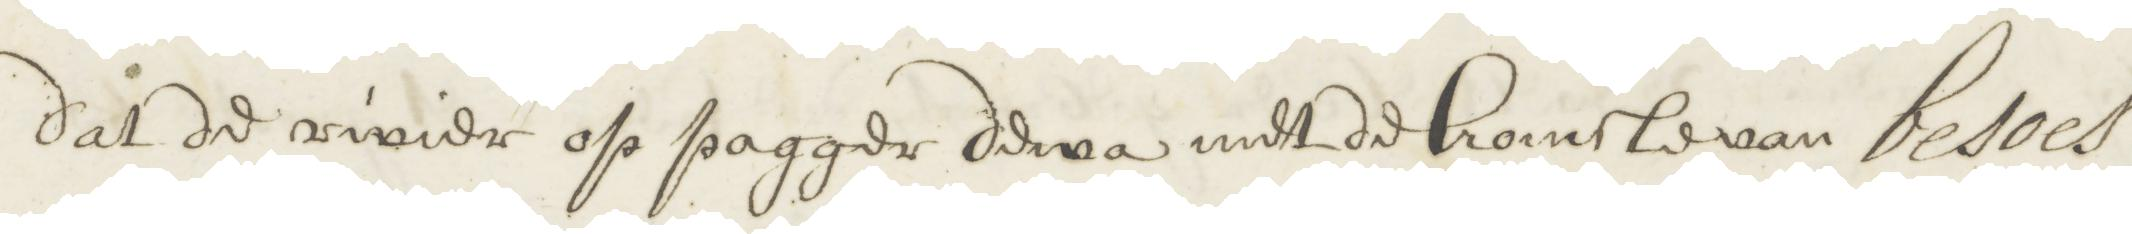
dat de rivier op pagger dewa met de komste van besoes
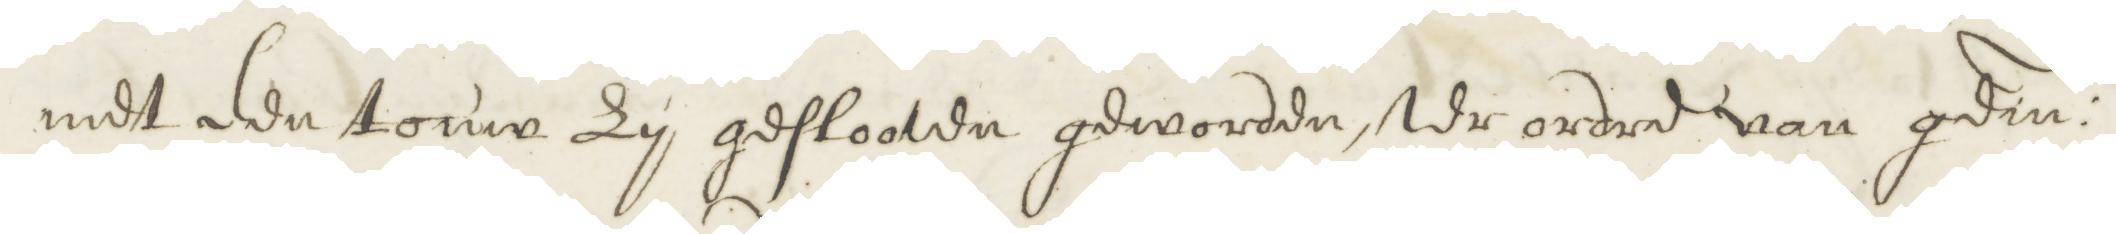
met een touw zij geslooten geworden, ter ordre van gem:
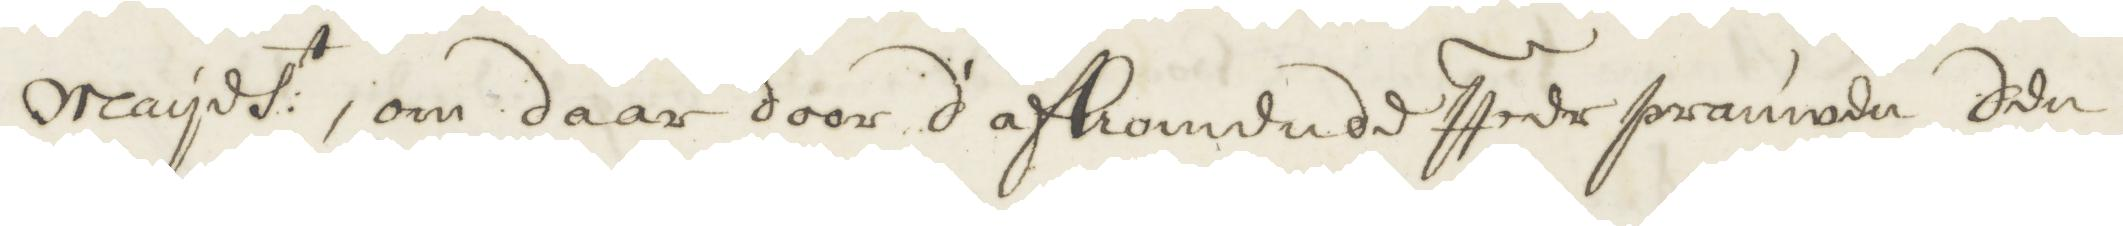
Maijes:t, om daar door d’ afkomende pper prauwen den
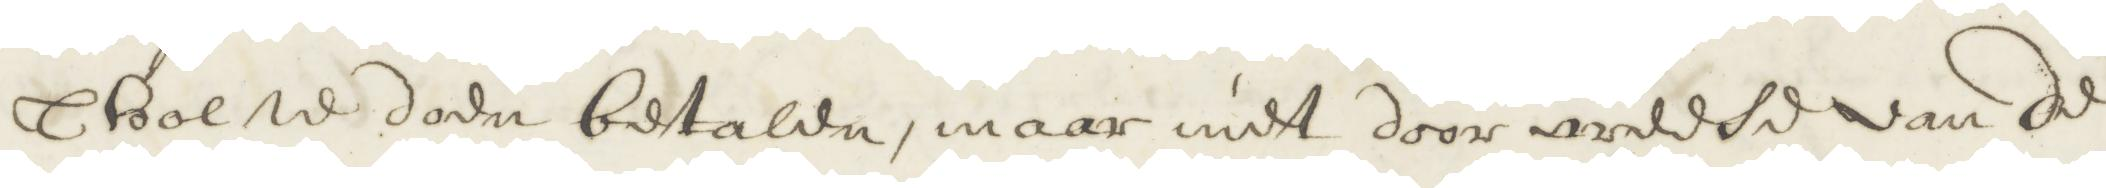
Thol te doen betalen, maar niet door vreese van de
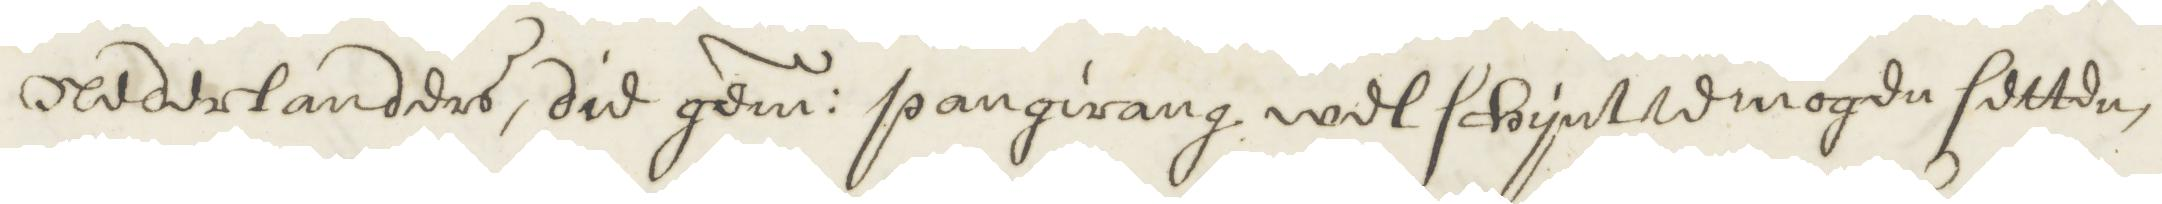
nederlanders, die gem: pangirang wel schijnt te mogen setten,
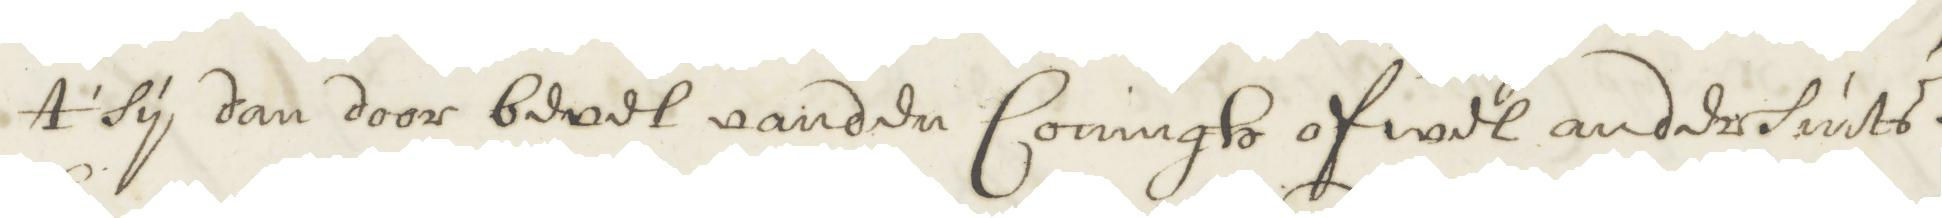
t' sij dan door bevel vanden Coningh of wel andersints
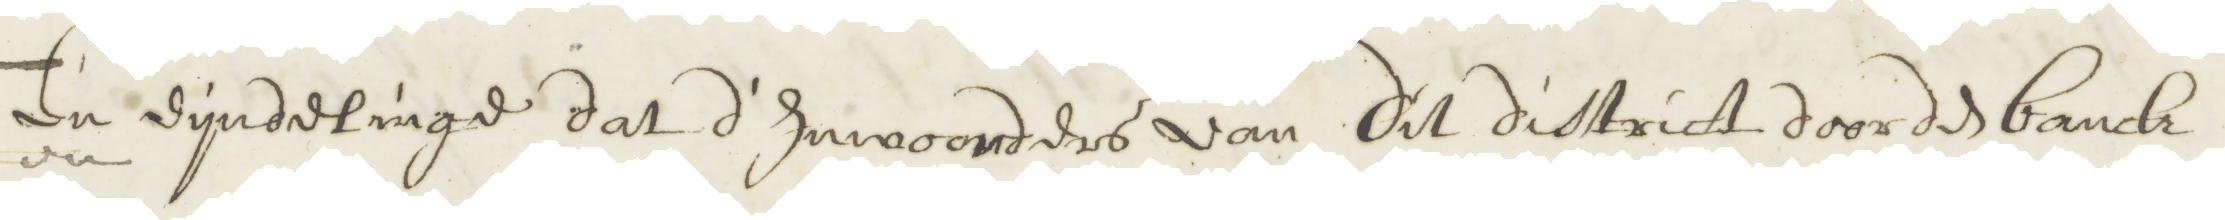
En eijndelinge dat d’Jnwoonders van dit district door den banck
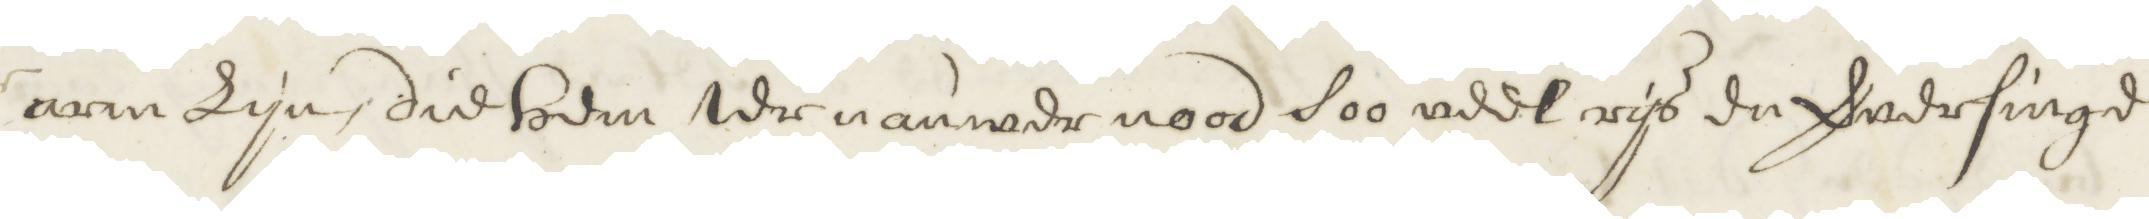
arm zijn, die hem ter nauwer nood soo veel rijs en verversinge
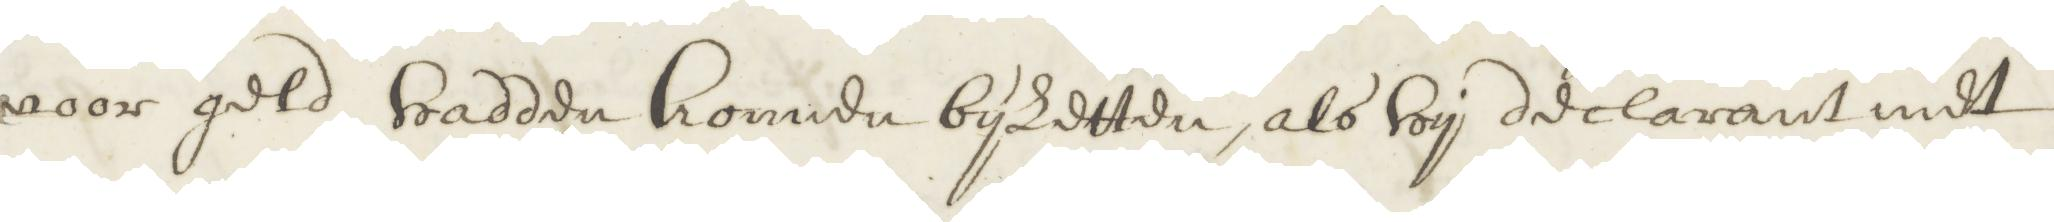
voor geld hadden konnen bijzetten, als hij declarant met
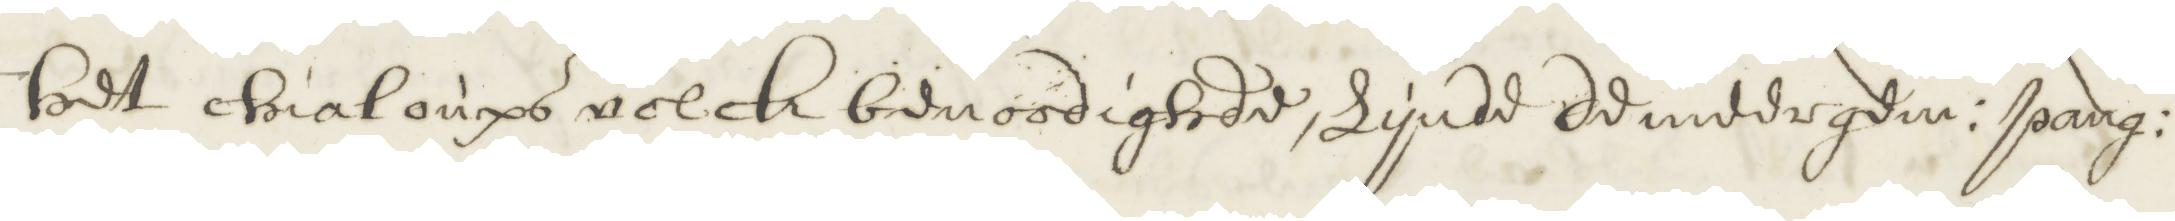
het chialoups volck benoodighde, zijnde de meer gem: pang:
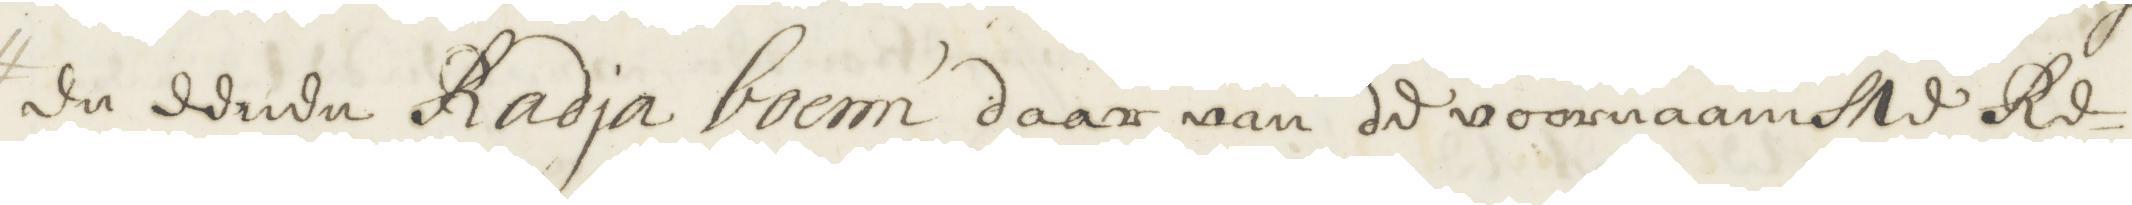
en eenen Radja boem daar van de voornaamste Re=
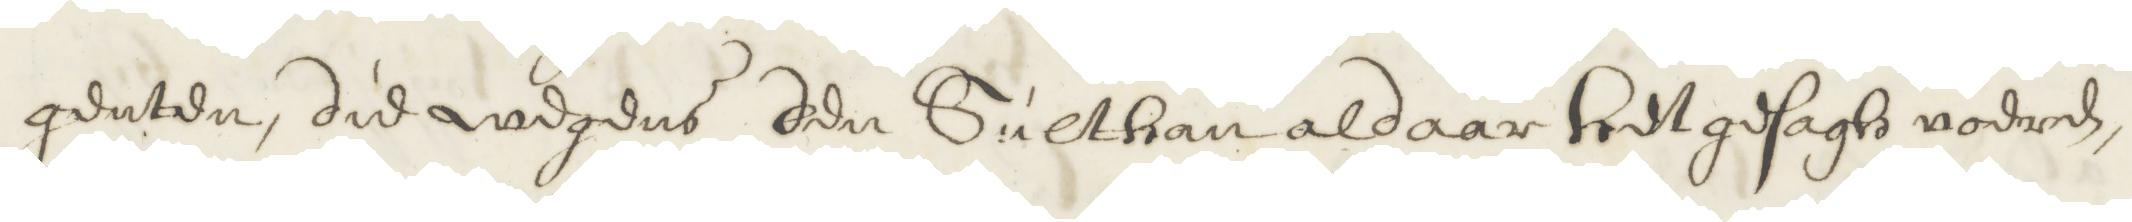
genten, die wegens den Sulthan aldaar het gesagh voeren,
